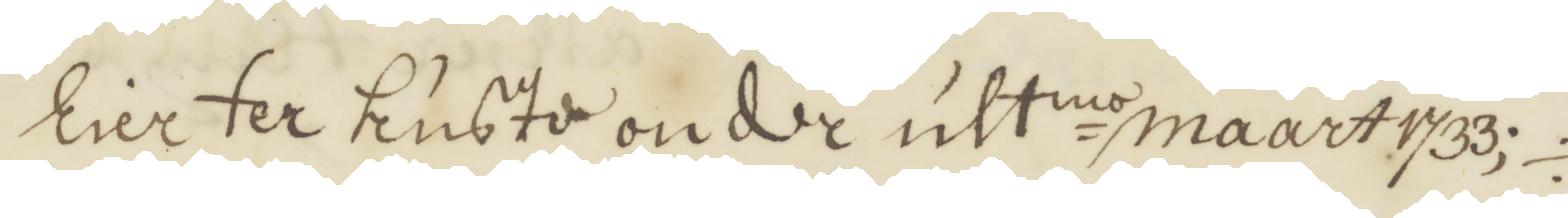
hier ter kuste onder ult:=mo maart 1733; ÷
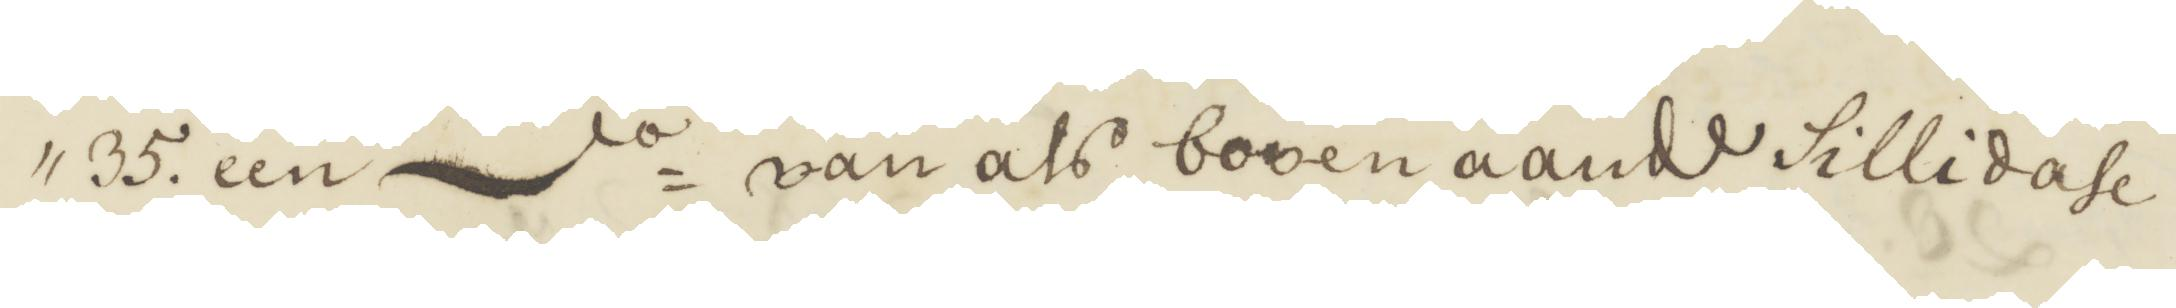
„ 35. een _=o van als boven aande Sillidase
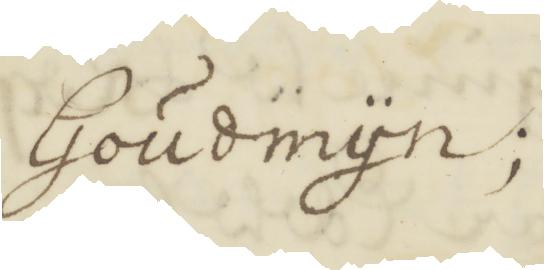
Goudmijn;
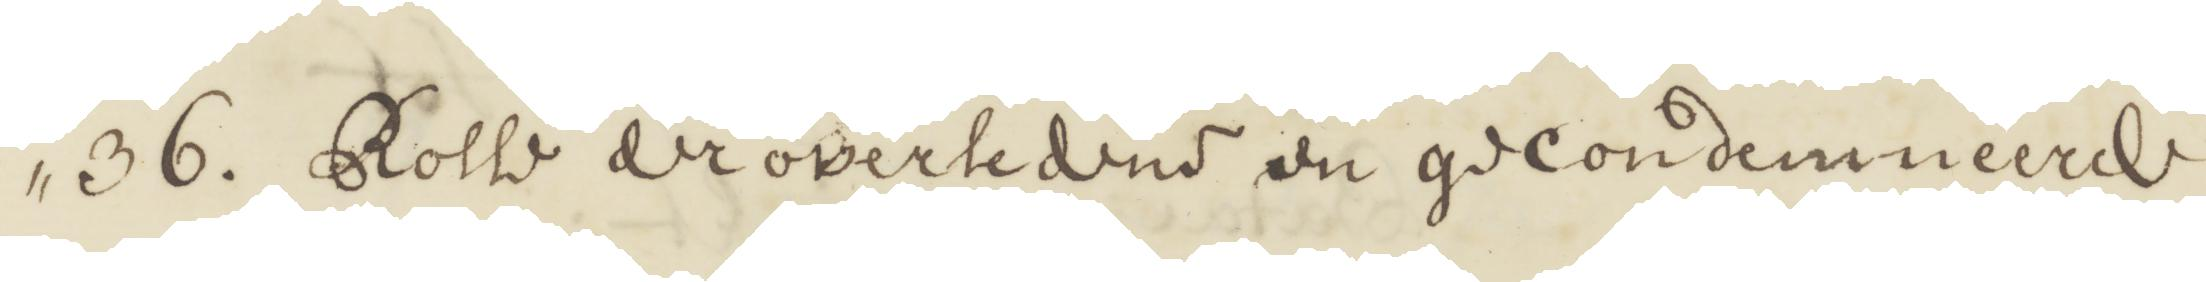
„ 36. Rolle der overledene en gecondemneerde
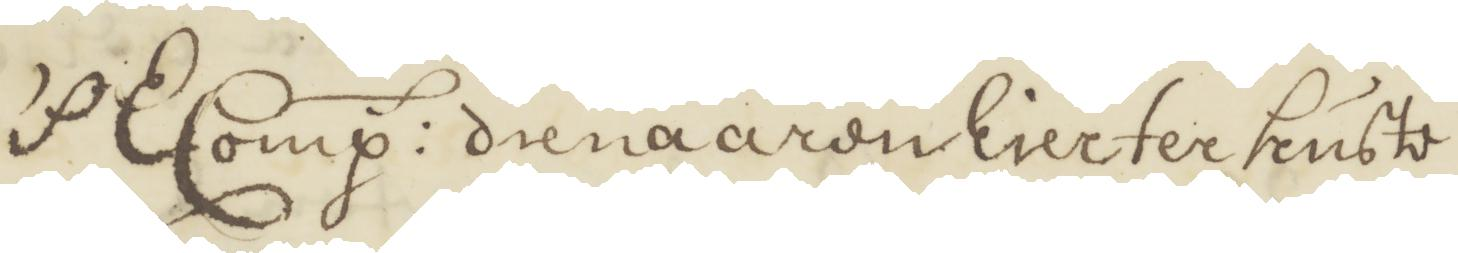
's E Comp:s dienaaren hier ter kuste
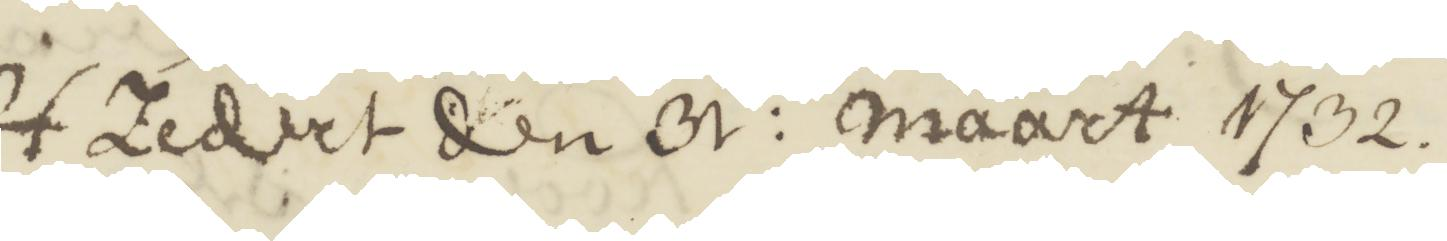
’t zedert den 31:' maart 1732.
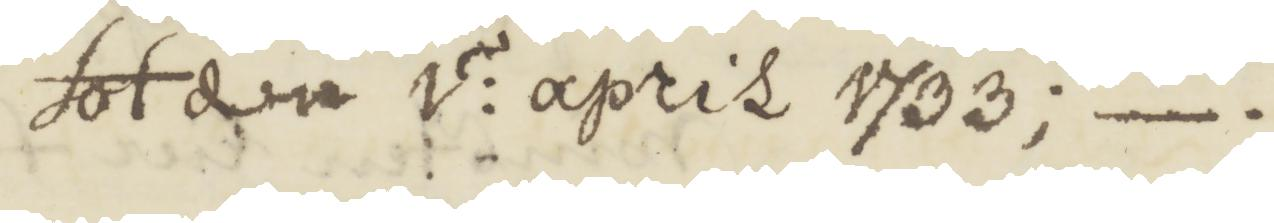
tot den 1:' apris 1733; —.
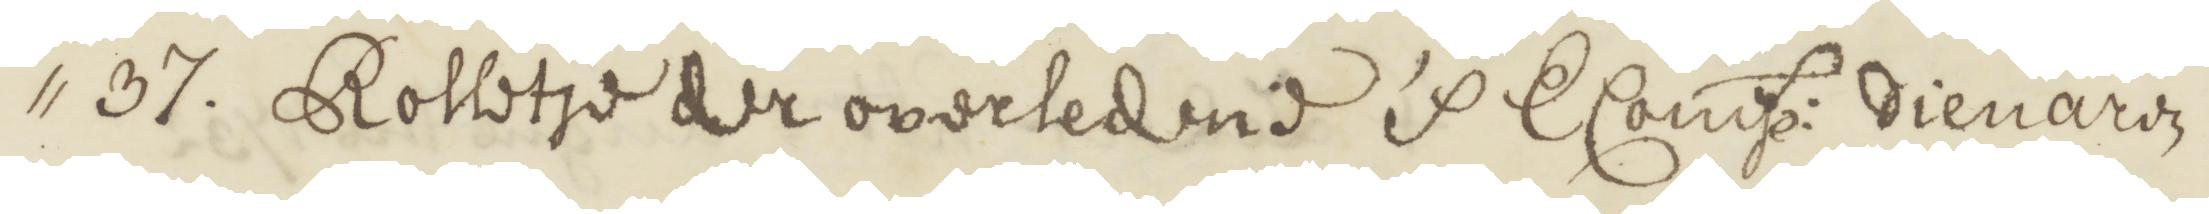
„ 37. Rolletje der overledene 's E Comp:s dienaren
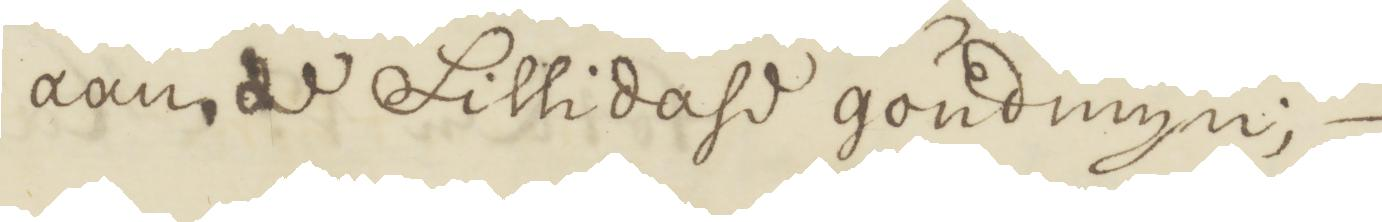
aan de Sillidase goudmijn; —
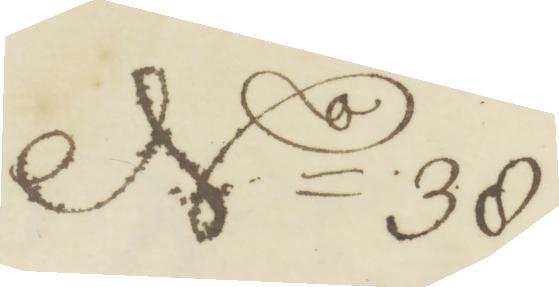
N=o 38
